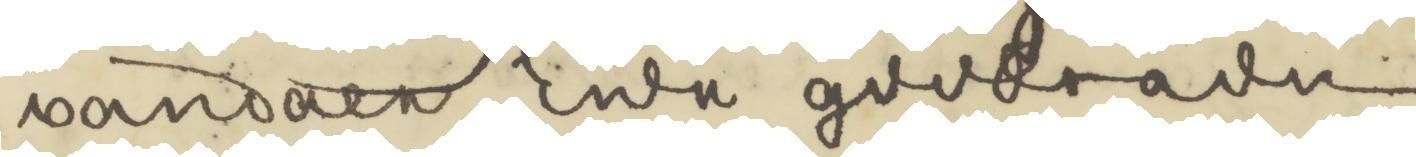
vandaer hier geeftaen
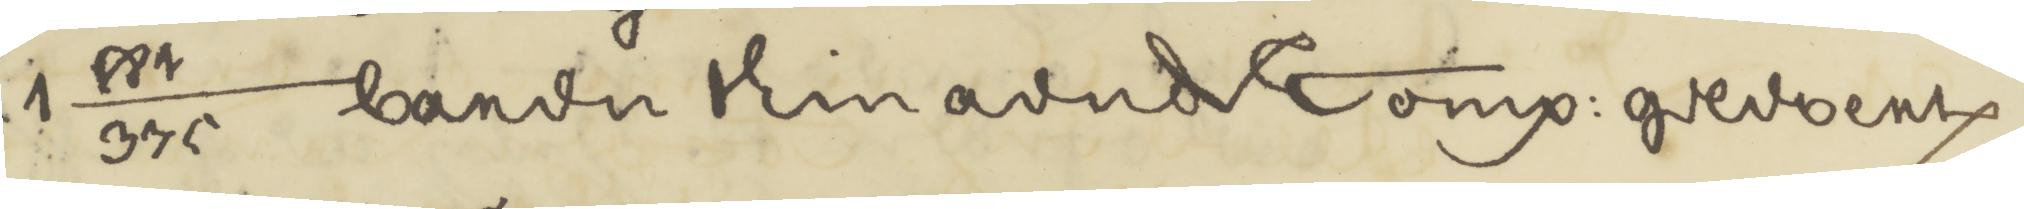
1 881/375 baren thin aen dE Comp: gelevert
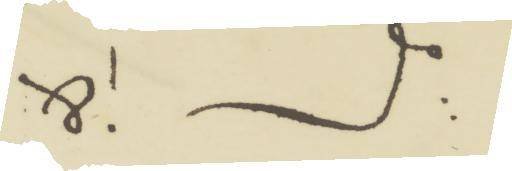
8.' D„o
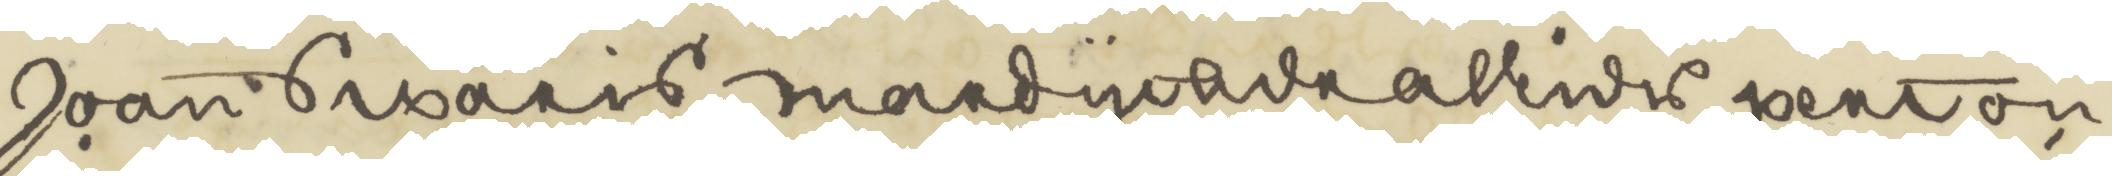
Joan Swaris mardijcker alhier percon
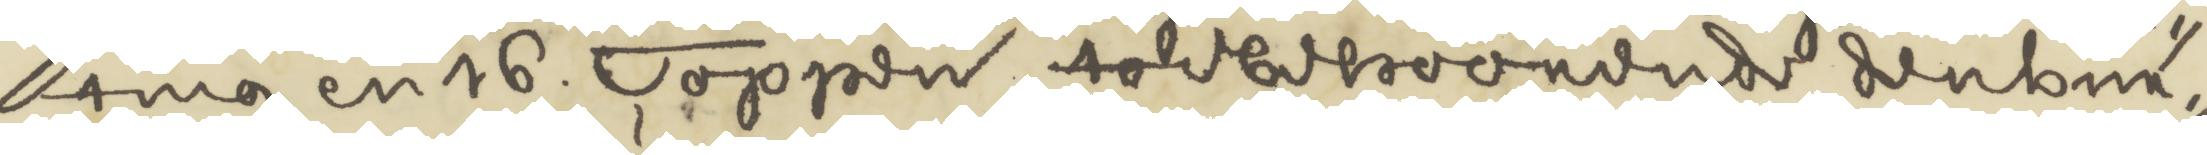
ting en 16. Coppen toebehoorende den bur„
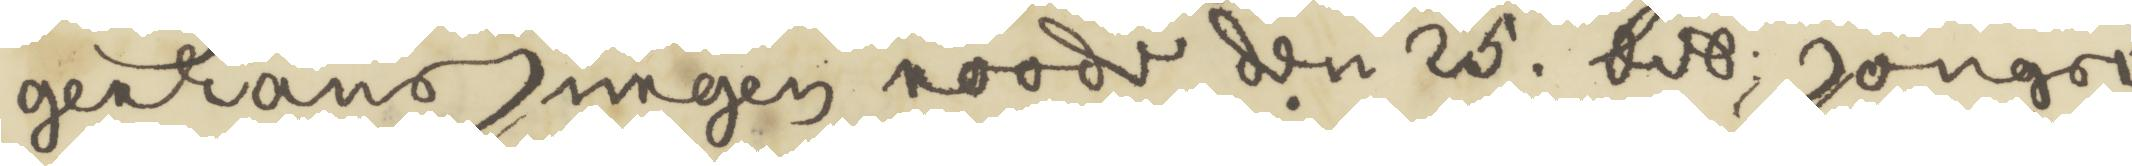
ger hans Jurgen roode den 25. feb; jongs
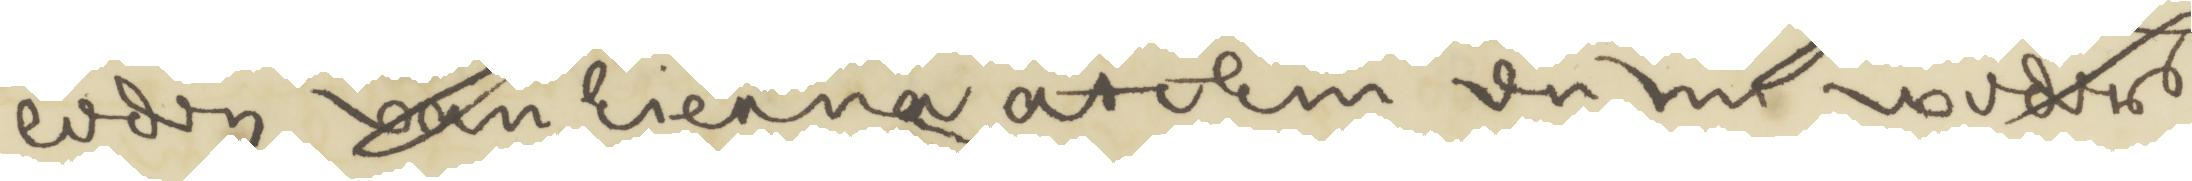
leden van hierna atchin en nu weders
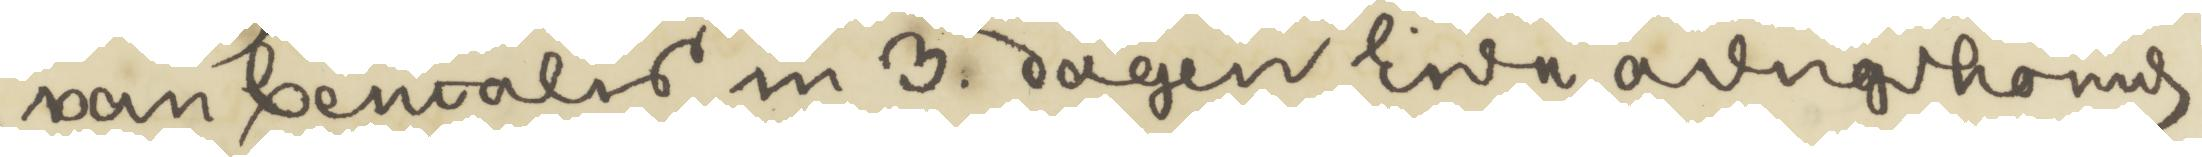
van bencalis in 3: dagen hier aengekomen
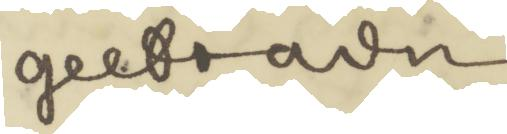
geeftaen
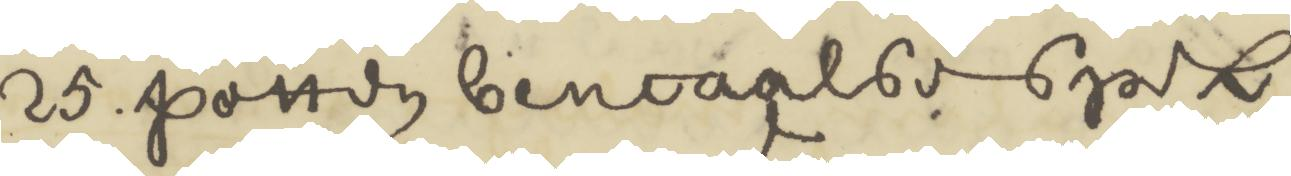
25. potten bencaalse spek
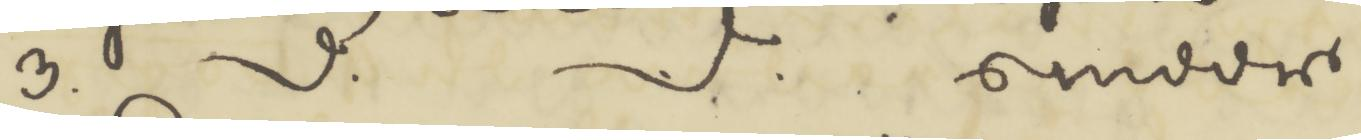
3. D.. D.. smeers
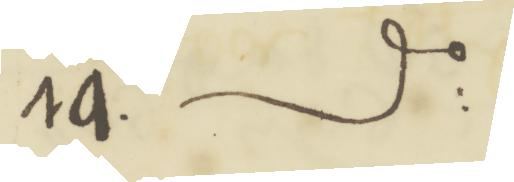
14.' D:o
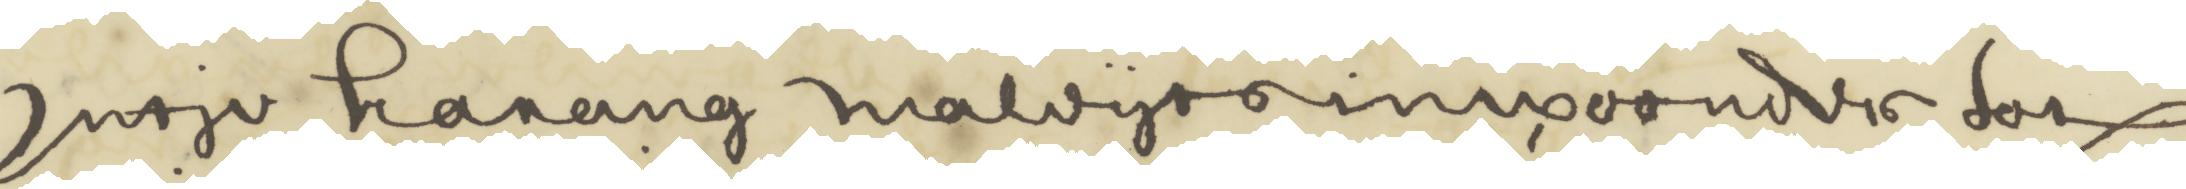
Intje karang maleijts inwoonder tot
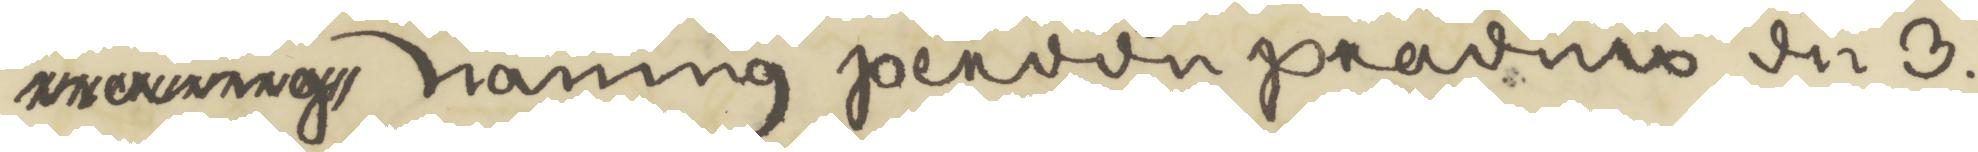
narring naning pereen praeuw en 3.
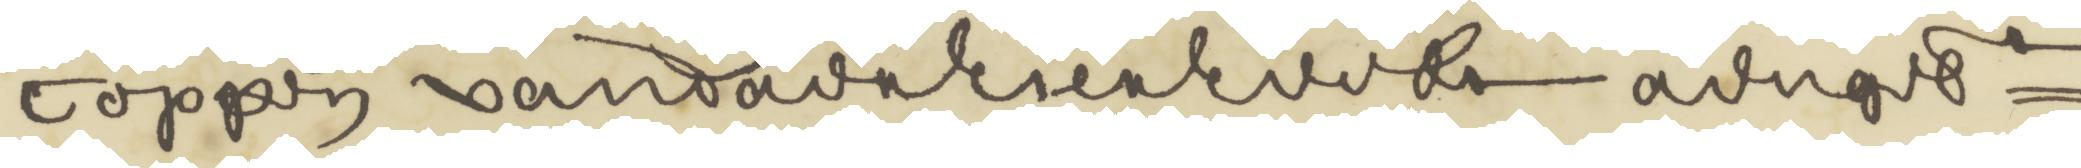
Coppen vandaerhierheeft aengeb=t
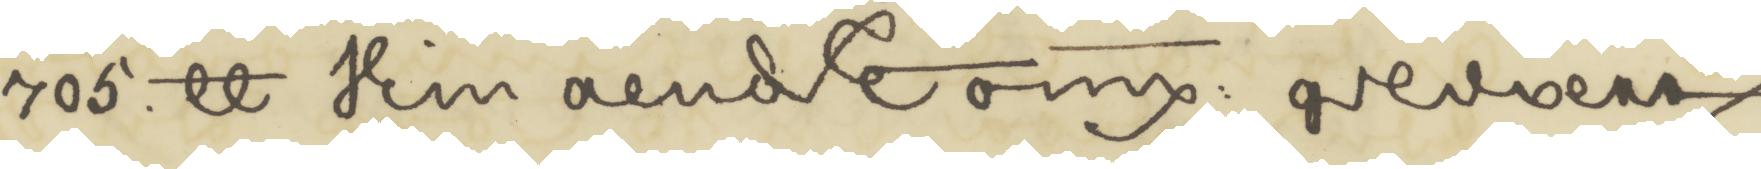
705. ll. thin aende EComp: gelevert
